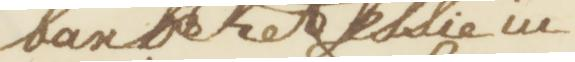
barberet sessie in
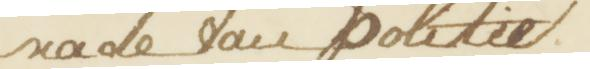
rade van politie
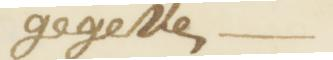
gegeven —
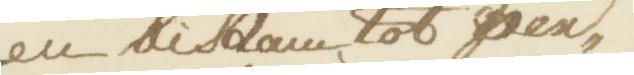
en bisdom tot per„
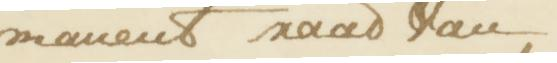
manent raad van
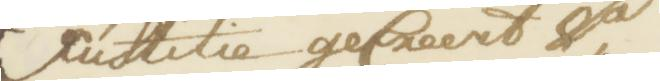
Justitie gecreert &„a
